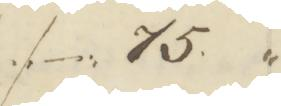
ƒ—: 75. „
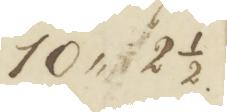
10„ 2½
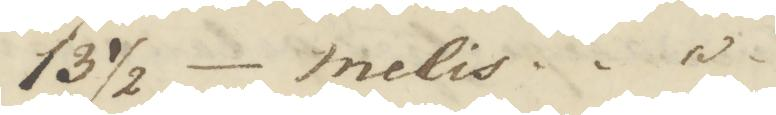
13½ — melis . - a
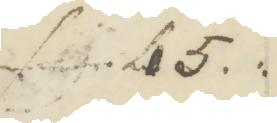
ƒ. 45. „
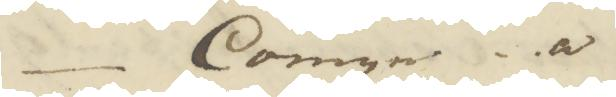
— Comyn -. a
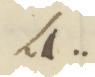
4..
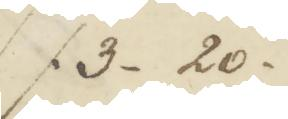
ƒ3- 20 -
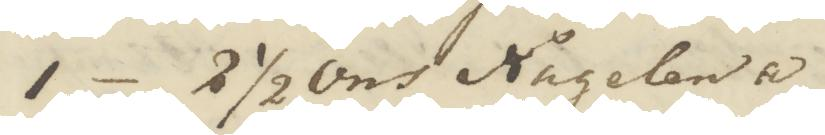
1 — 2½ ons Nagelen a
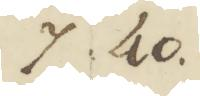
7: 40.
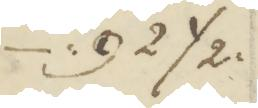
—:9272:
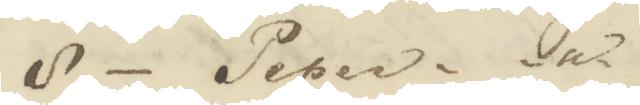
8 — Peper - - a
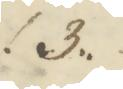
ƒ3„
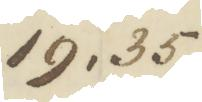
19,35.
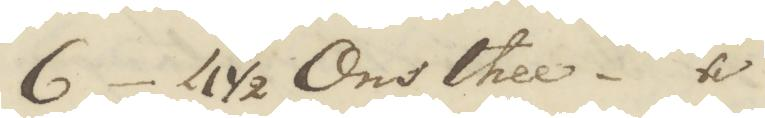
6 — 4½ Ons thee - a
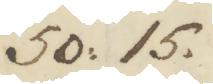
50: 15.
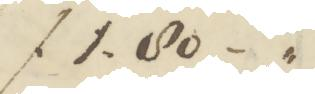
ƒ 1. 80 - „
